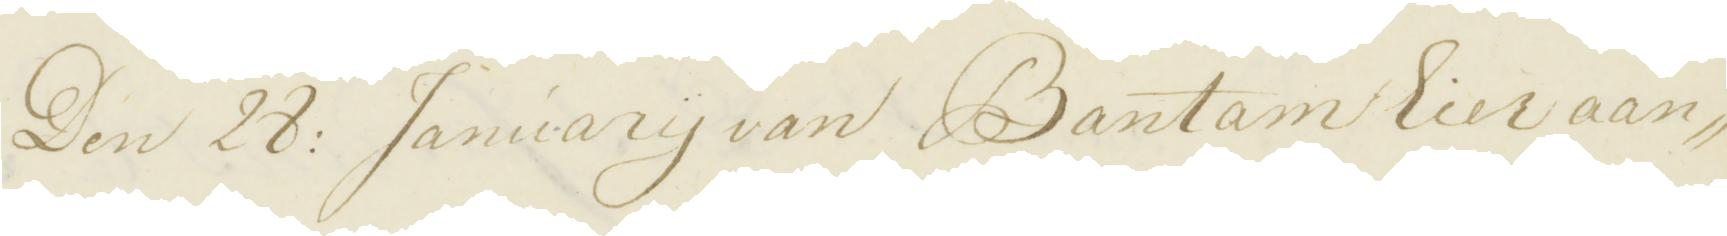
Den 28: Januarij van Bantam hier aan„
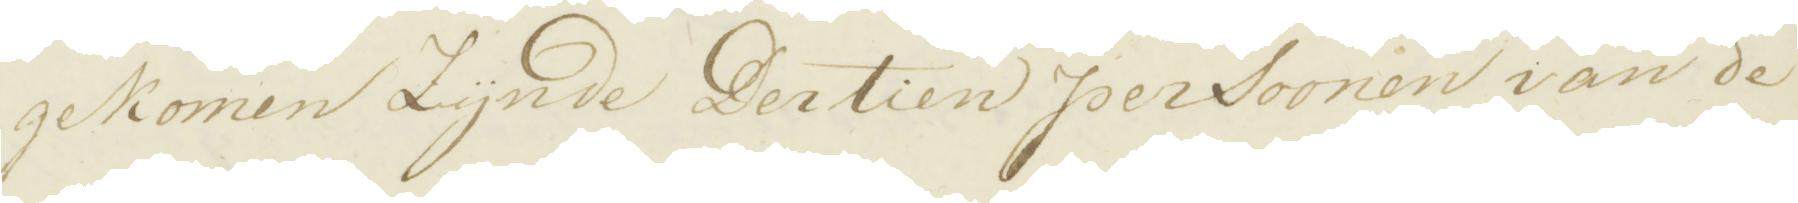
gekomen Zijnde Dertien persoonen van de
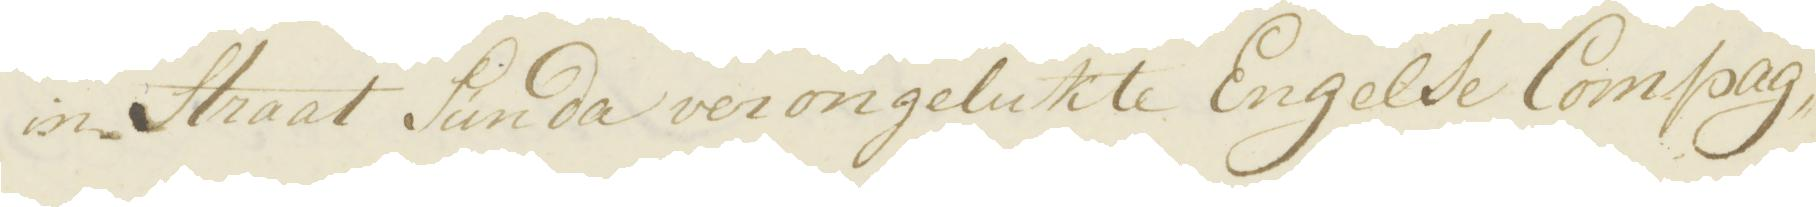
in straat sunda verongelukte Engelse Compag„
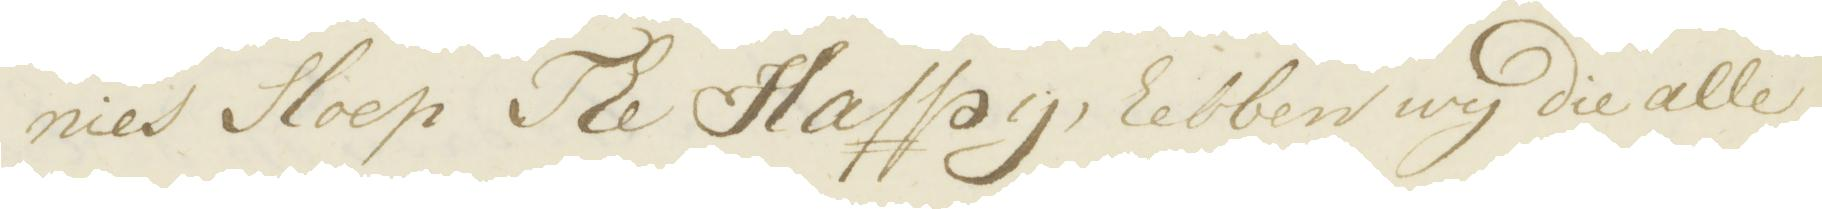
nies sloep The Happy hebben wy die alle
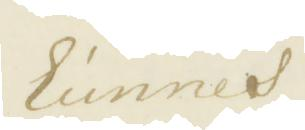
hunnes
